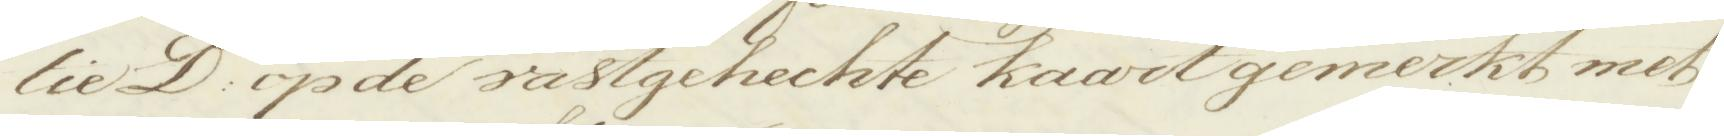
tie D: op de vastgehechte kaart gemerkt met
